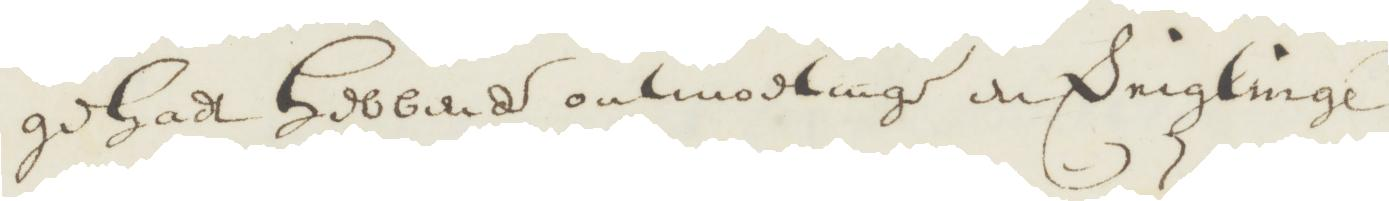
gehadt hebbende ontmoetinge en verrigtinge
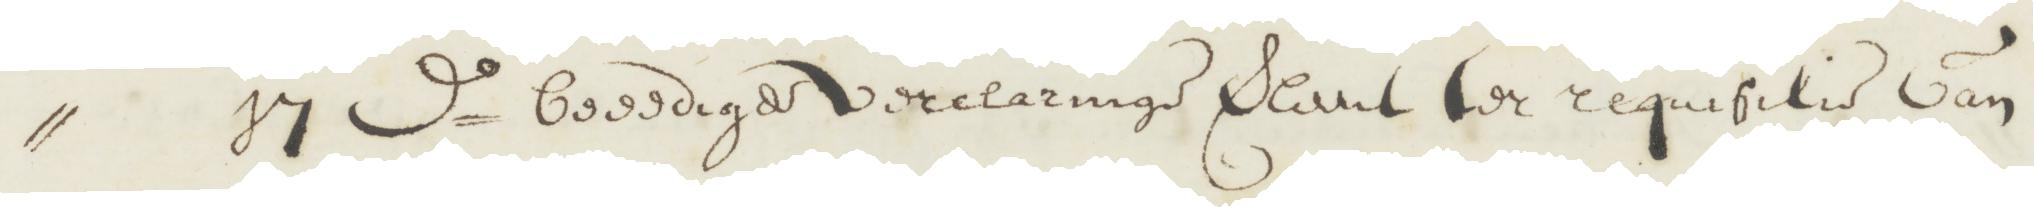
„ 17 _=o beeedigde verclaringe verleent ter requisitie van
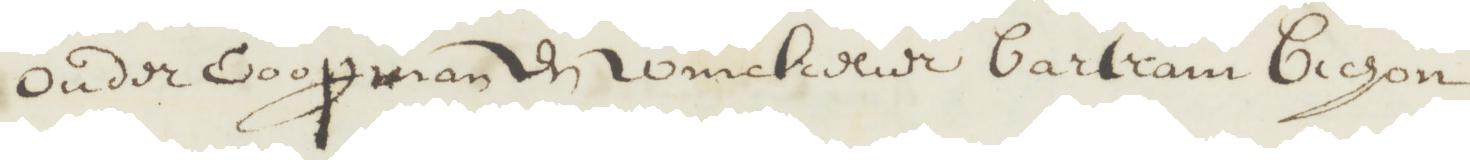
onder Coopman en winckelier bartram Bichon
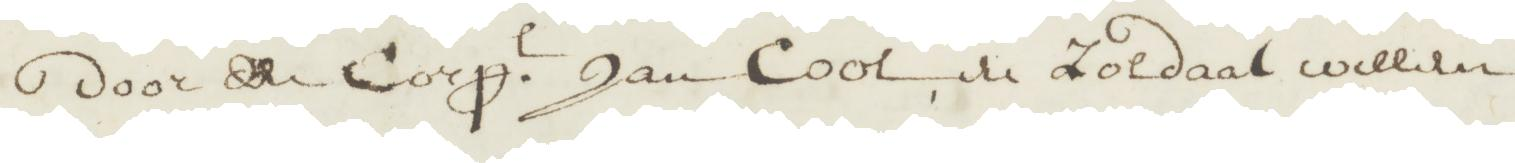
door den Corp.l Jan Cool, en zoldaat willem
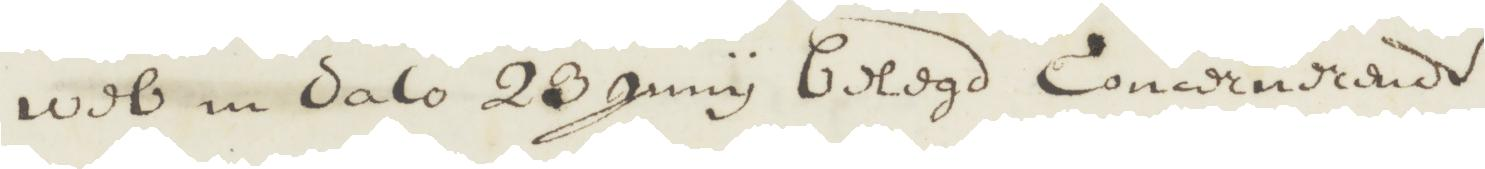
wel in dato 23 Junij belegd Concernerende
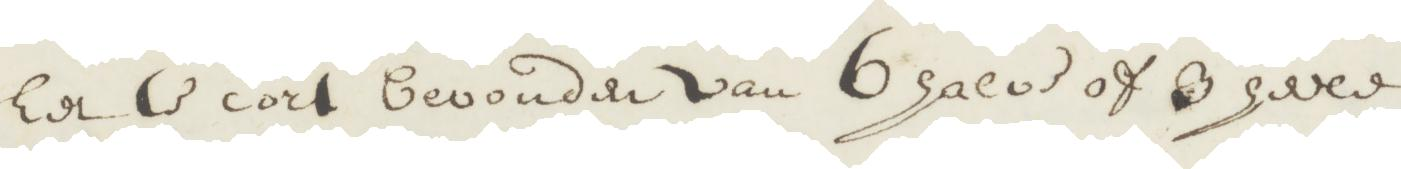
het te cort bevonden van 6 halve of 3 heele
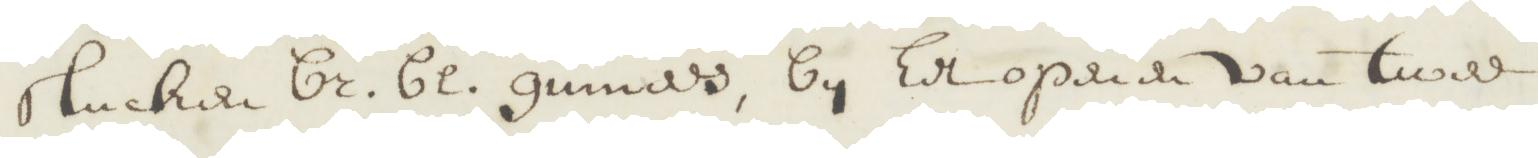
stucken br. bl. guinees, by het openen van twee
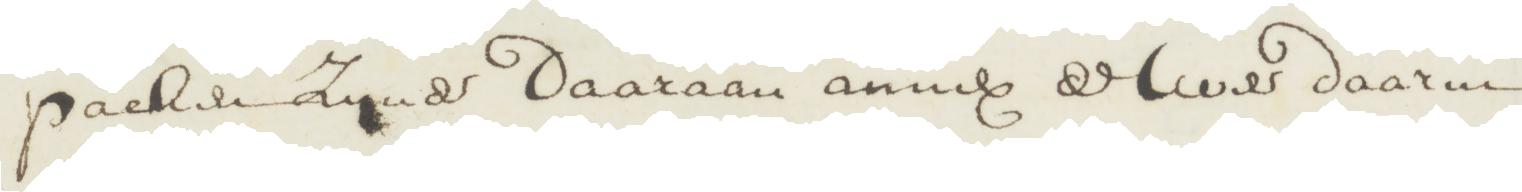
packen zynde daaraan annex de twee daarin
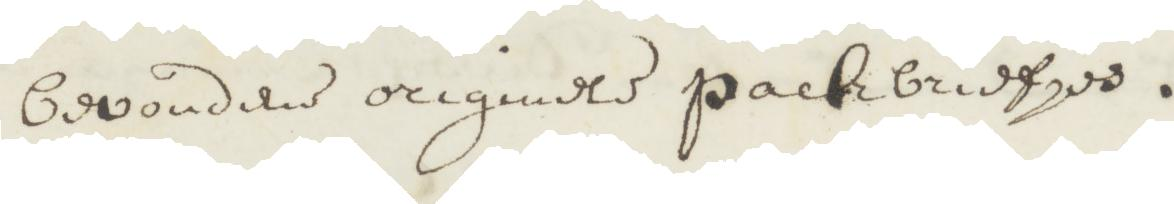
bevondene originele packbriefjes.
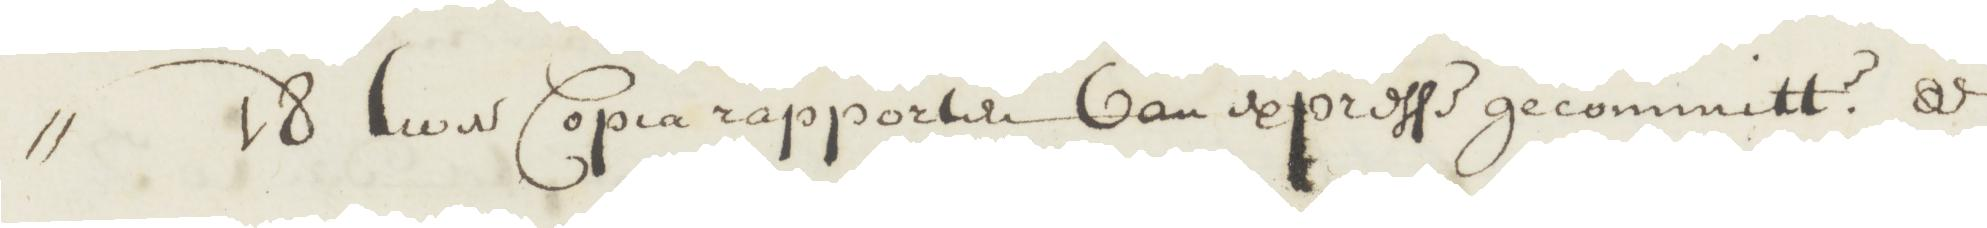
„ 18 twee Copia rapporten van expresse gecommitt.s de
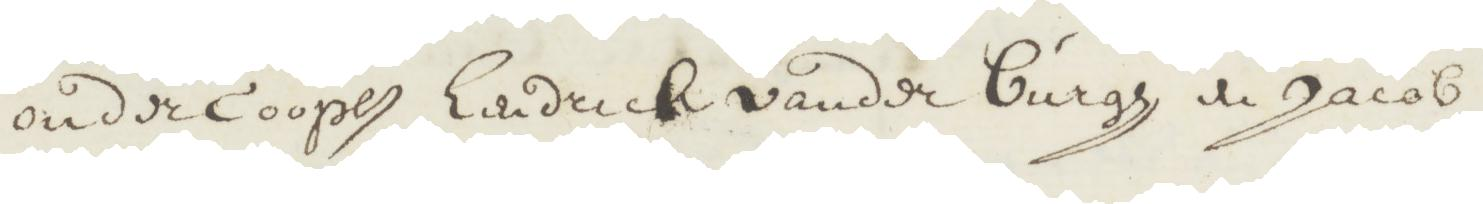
ondercoopl hendrick van der Burgh en Jacob
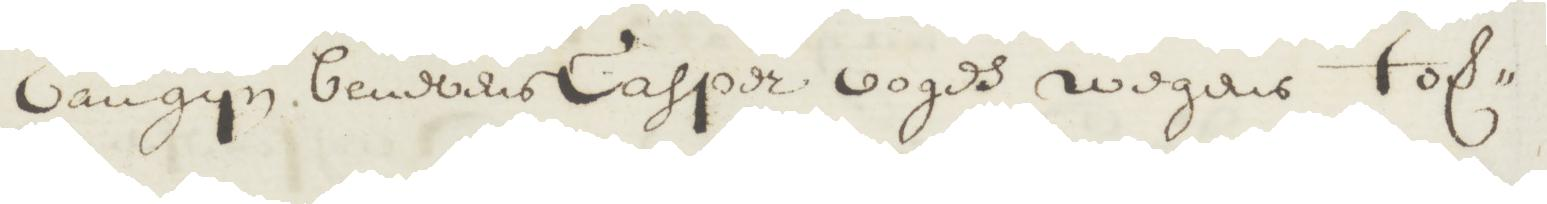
van gijn benevens Casper voges wegens 'tover„
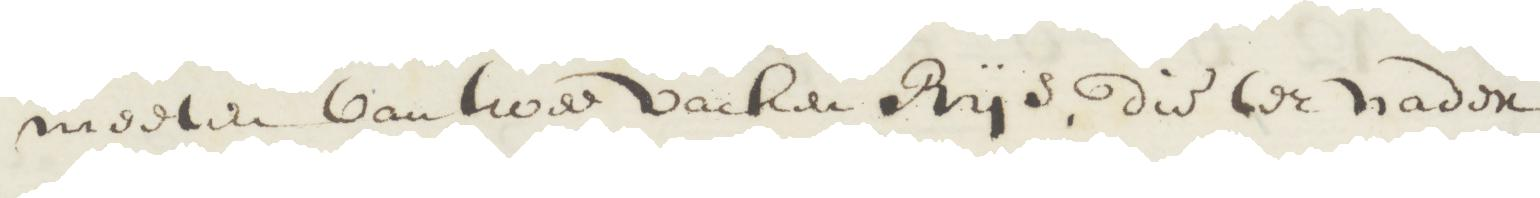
meeten van twee vacken Rijs, die ter nader
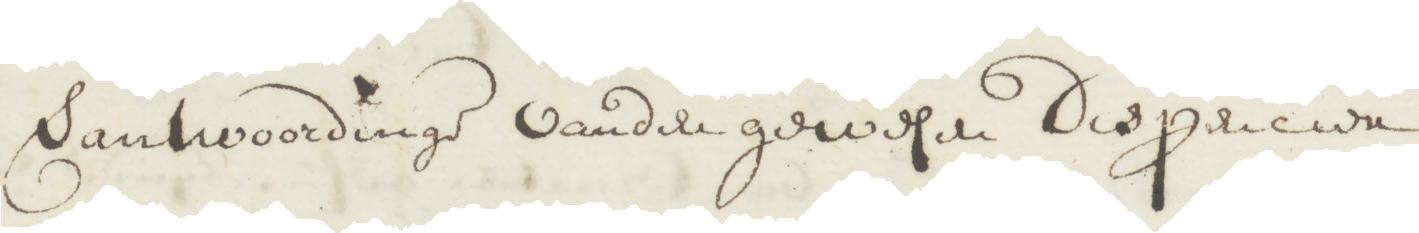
verantwoordinge van den gewesen dispencier
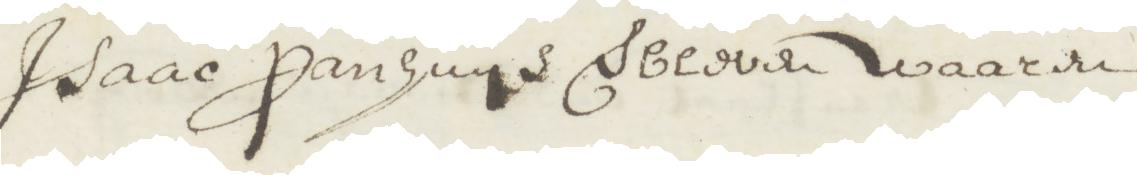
Jsaac Panhuijs verbleven waaren
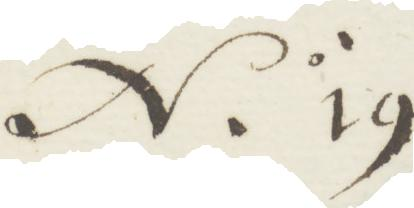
N.o 19
